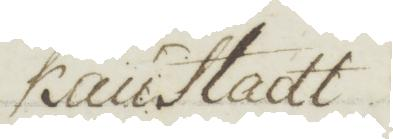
kaustadt
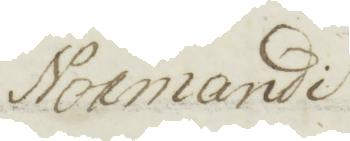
Normandi
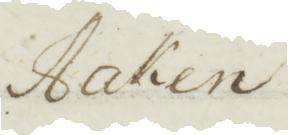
Aaken
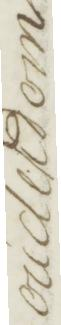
ouderdom
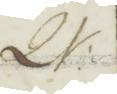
21:
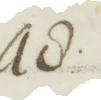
48:
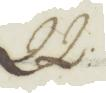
22:
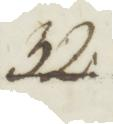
32:
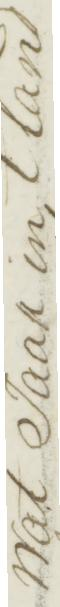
wat Iaar in 't land
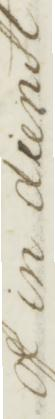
of in dienst
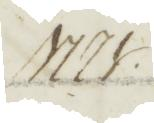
1771.
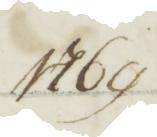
1769
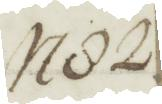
1782
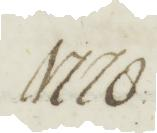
1778:
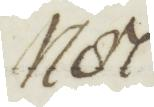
1787
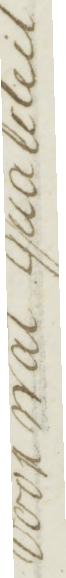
voor wat qualiteit
